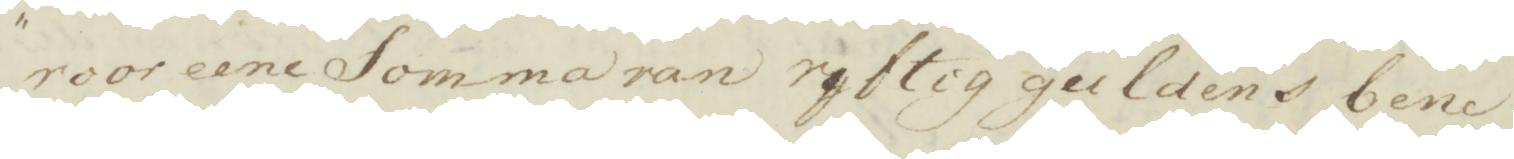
voor eene somma van vyftig guldens bene
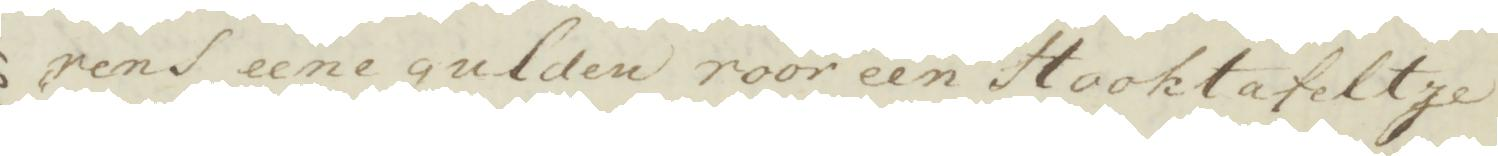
vens eene gulden voor een stooktafeltje
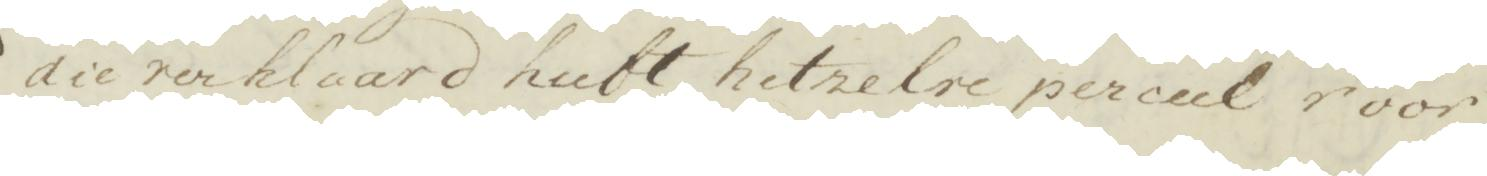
die verklaard heeft hetzelve perceel voor
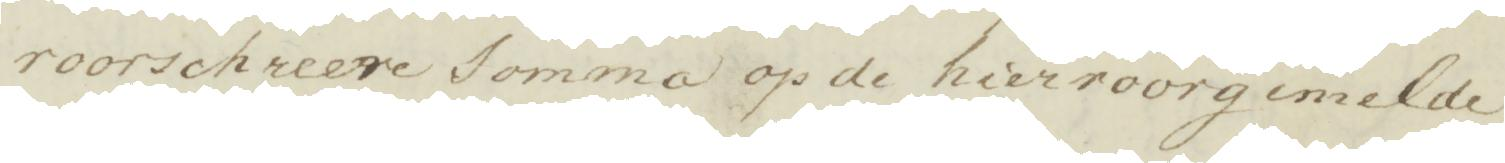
voorschreeve somma op de hiervoorgemelde
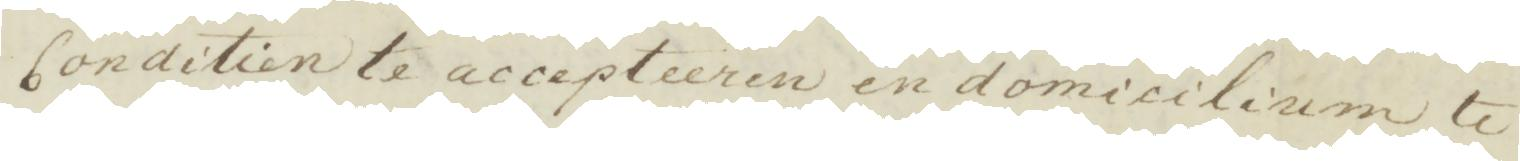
Conditien te accepteeren en domicilium te
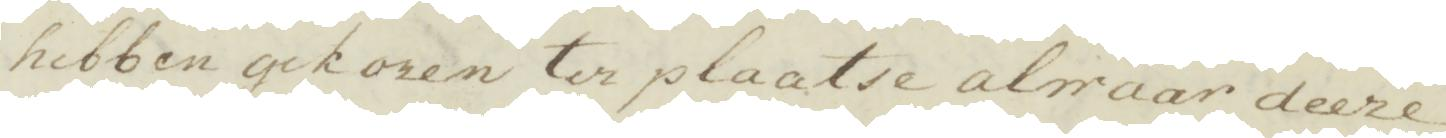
hebben gekozen ter plaatse alwaar deeze
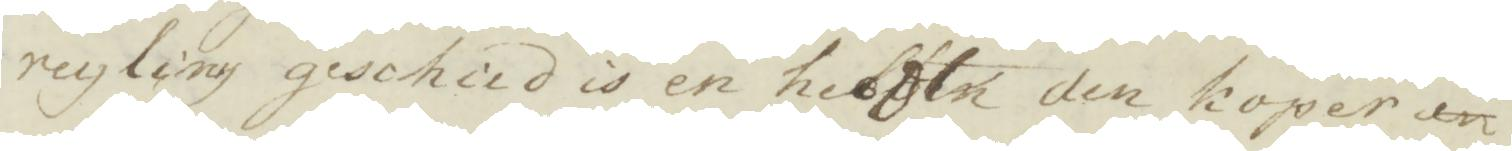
veyling geschied is en heeft den koper en
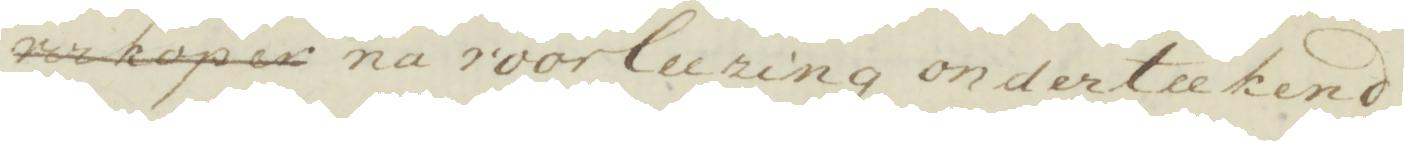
verkoper na voorleezing onderteekend
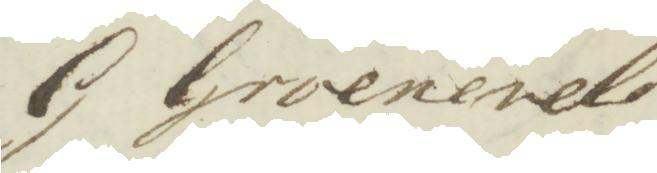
G Groeneveld
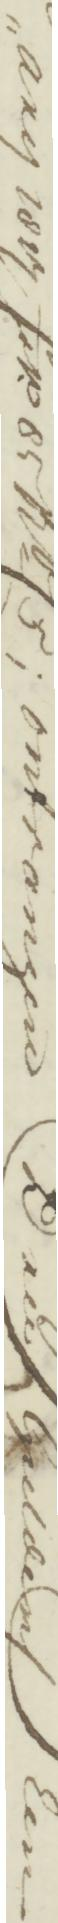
„ary 1817 fol.o 85 R=o; ontvangen Drie Guldens Een
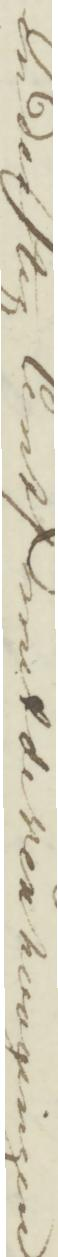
en dertig Cents met de verhoogingen
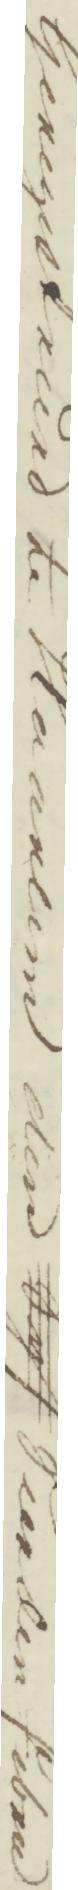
Geregistreerd te Haarlem den Vyf Vierden Febru
